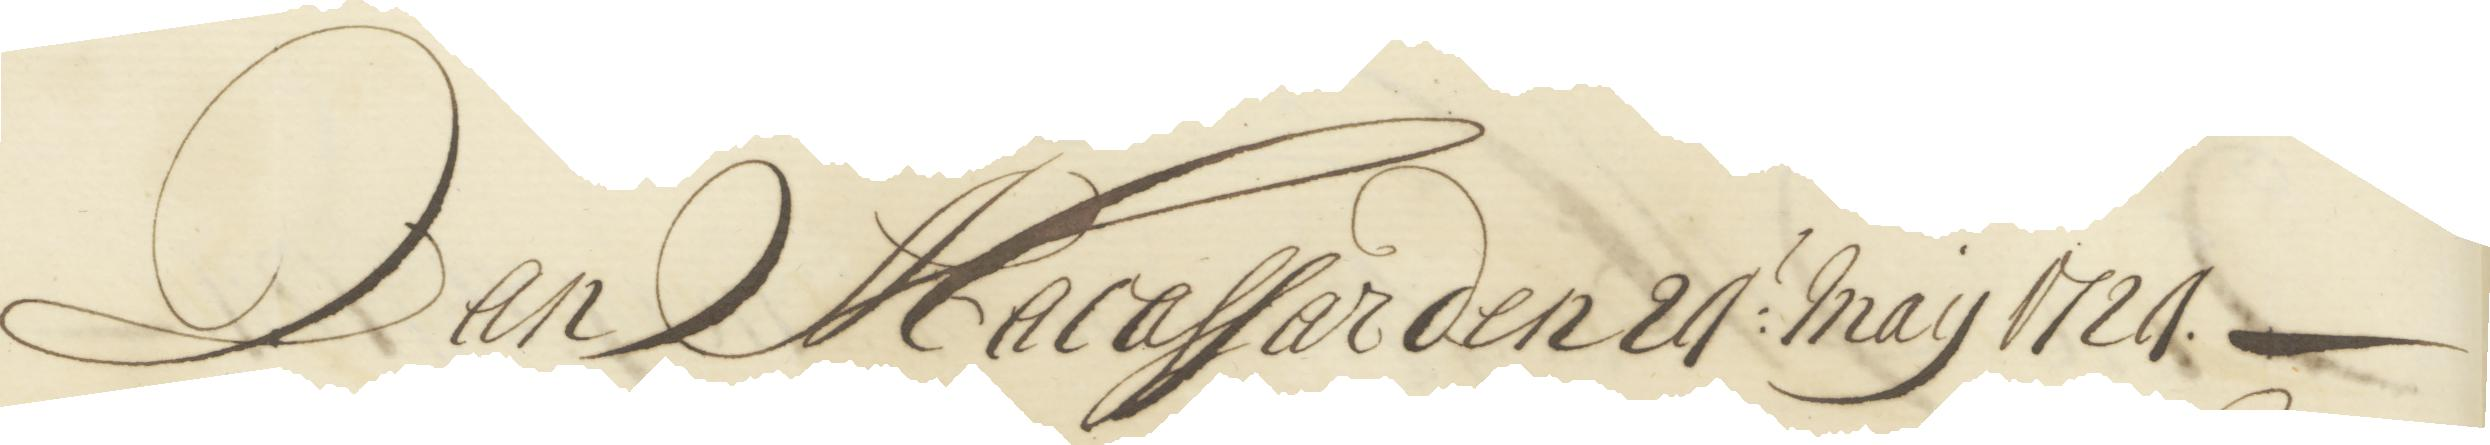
Van Macassar den 24:' maij 1724.—
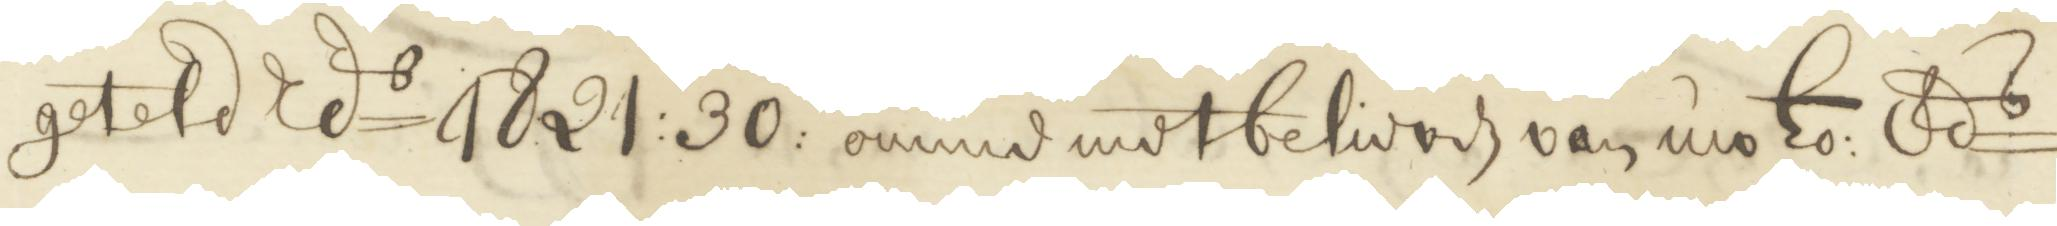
geteld Rd=s 4821: 30: omme met believen van uw ho: Ed=s
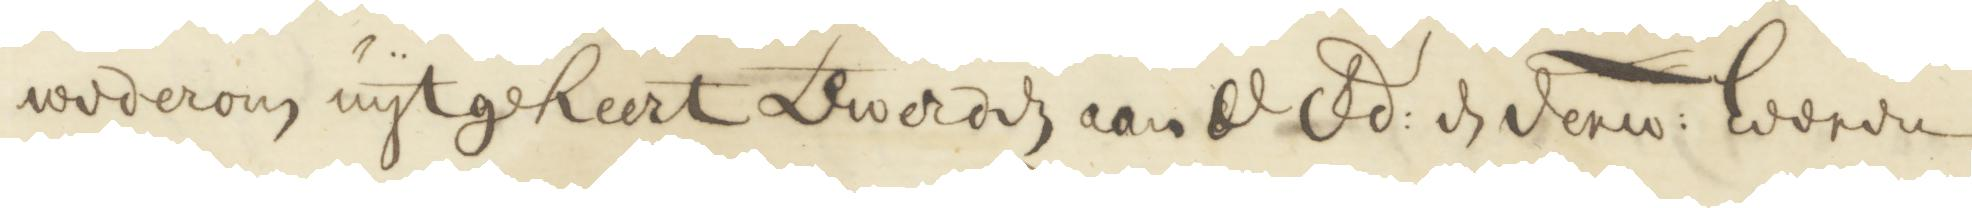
wederom uijtgekeert te werden aan de Ed:' en Eerw: heeren
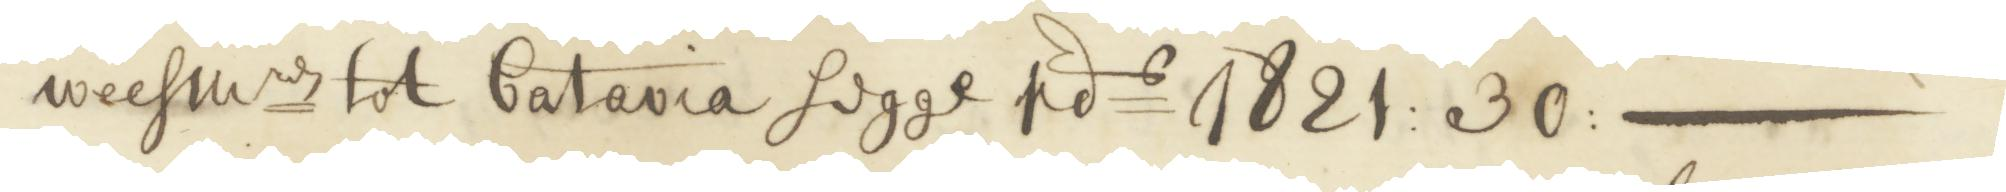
weesm=rs tot batavia segge rd=s 1821:30: —
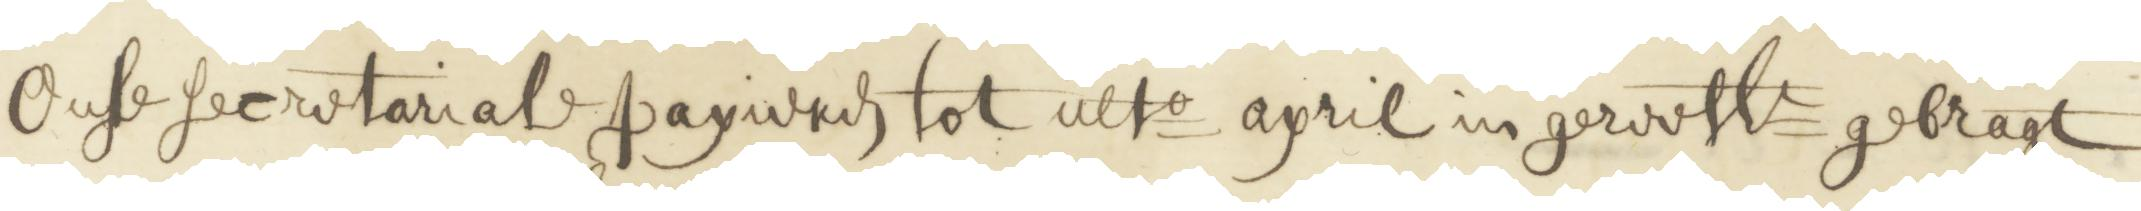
Onse secretariale papieren tot ult=o april in gereeth=t gebragt
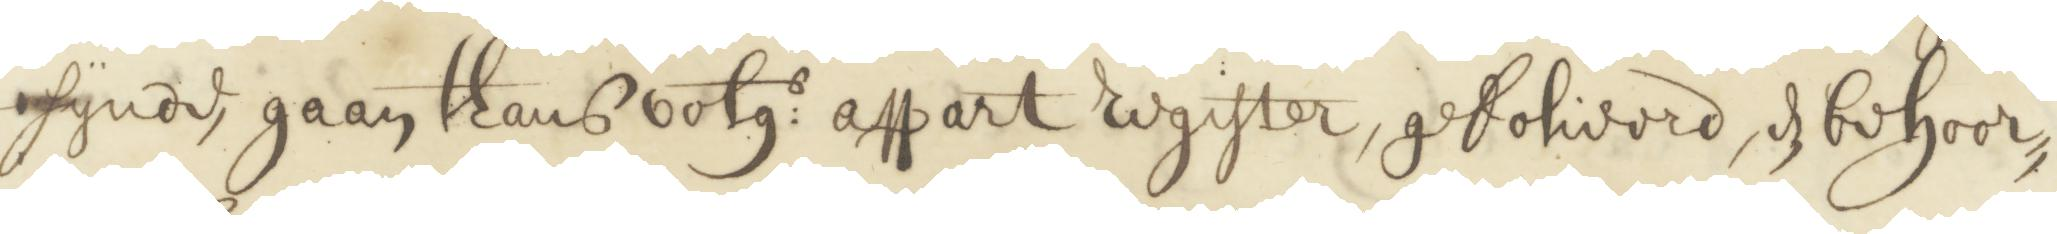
sijnde, gaan thans volg:s appart register, gefolieerd, en behoor„
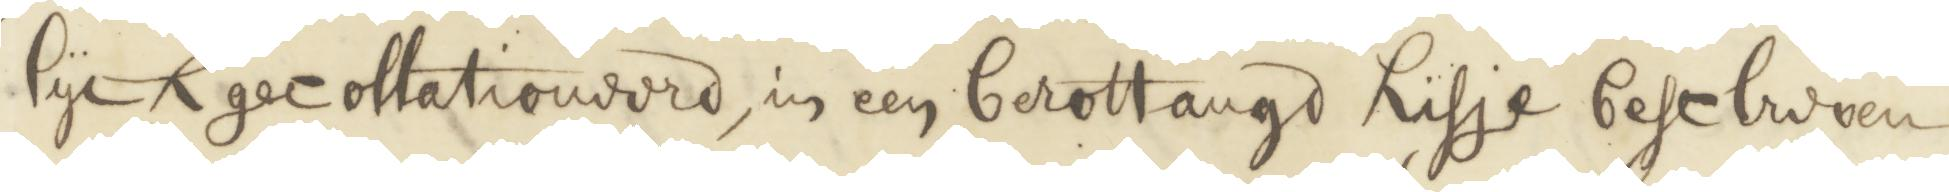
lijck gecollationeerd, in een berottangd kisje beschreven
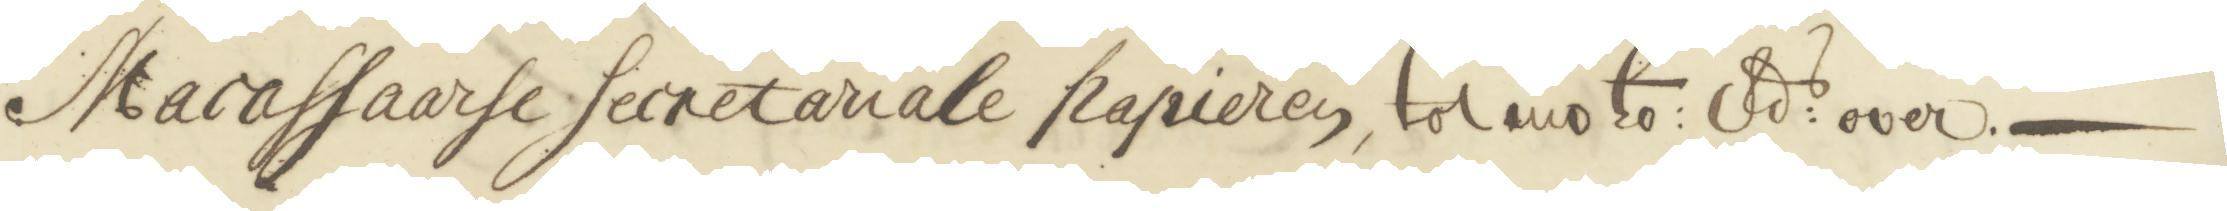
Macassaarse secretariale papieren, tot uw ho: Ed:s over. —
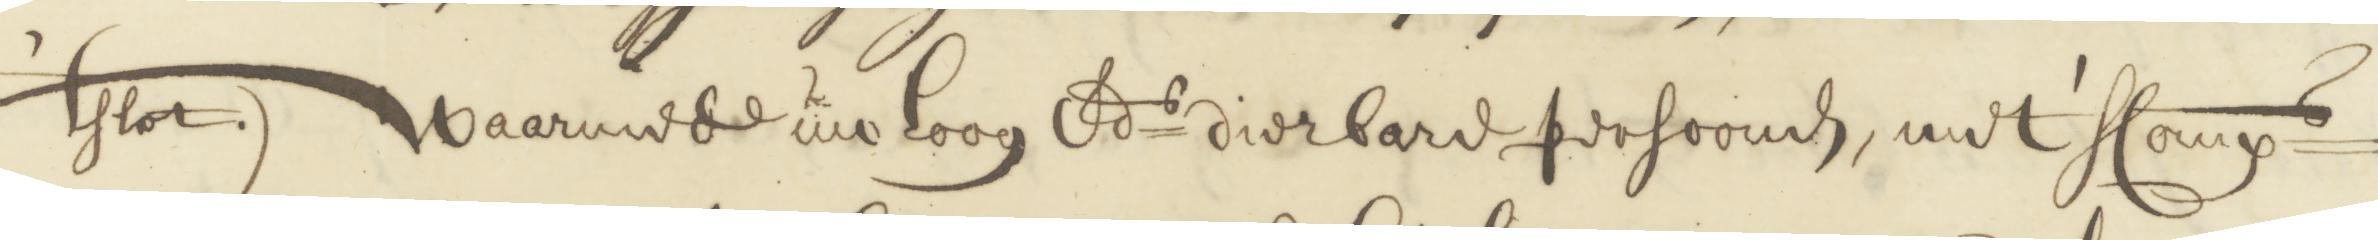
'tslot waarmede uw hoog Ed=s dierbare persoonen, met 'sComp=s
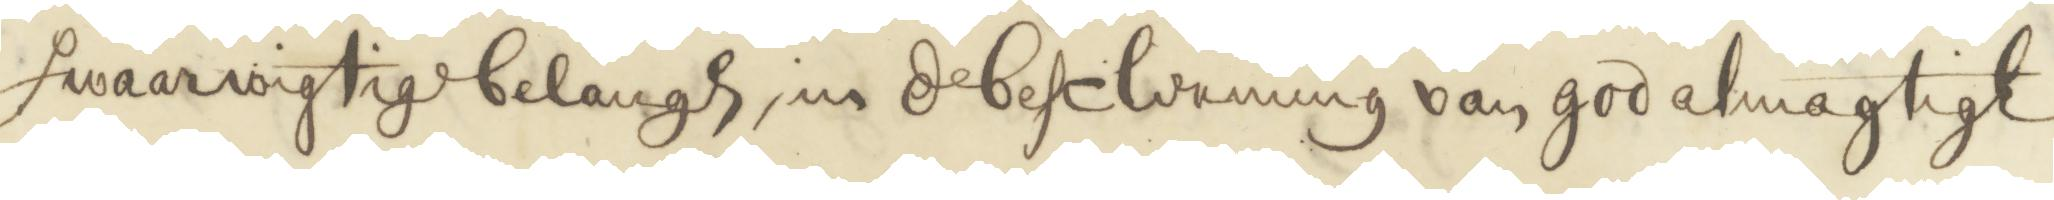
swaarwigtige belangen, in de bescherming van god almagtigh
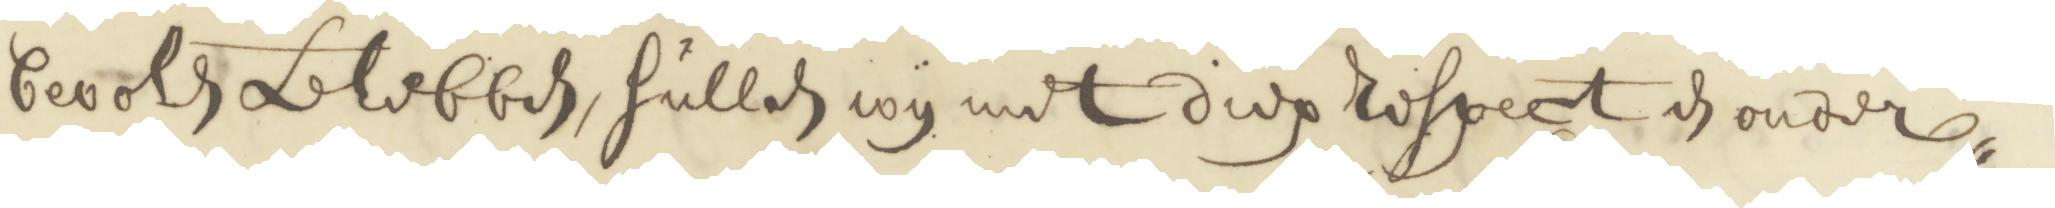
bevolen te hebben, sullen wij met diep respect en onder„
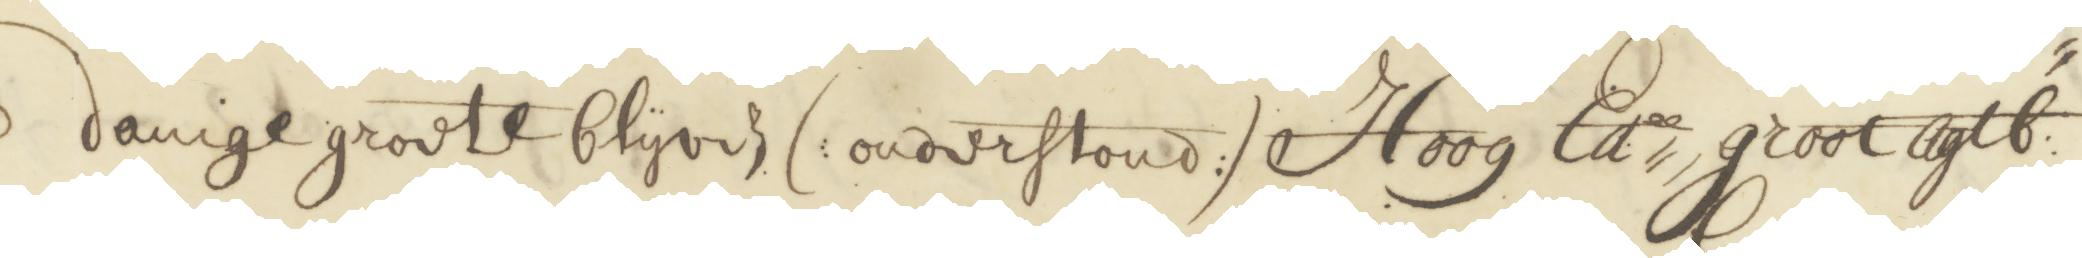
danige groete blijven (:onderstond:) Hoog Ed=le groot agtb:
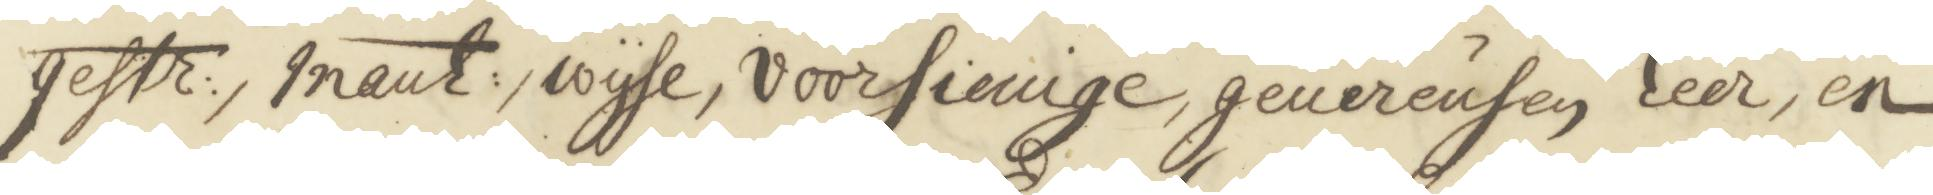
gestr:, manh:, wijse, voorsienige, genereusen heer, en
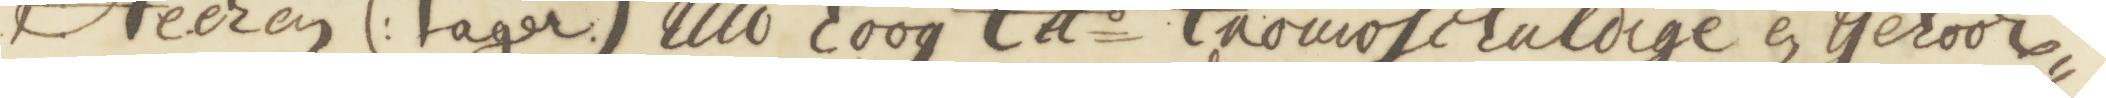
Heeren (:lager:) uw hoog Ed=s trouwschuldige en gehoor„
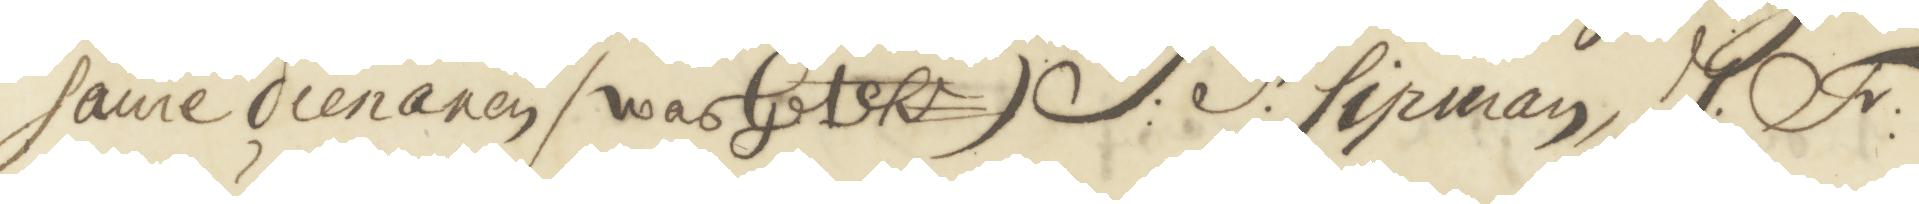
same dienaren /was getek=t) I: P: Sipman, J. Tr:
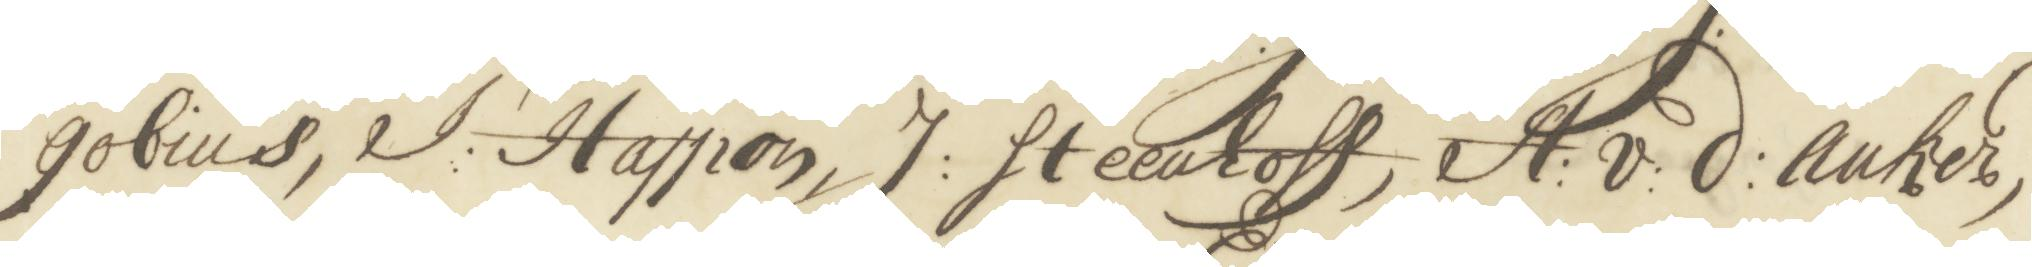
gobius, I: Happon, J: steenhoff, H: v: d: anker,
